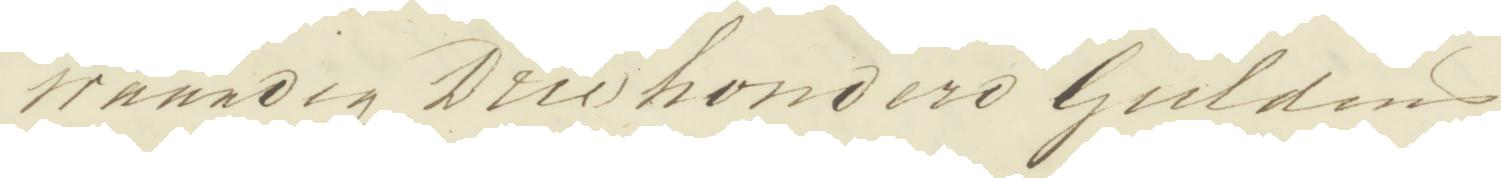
waardig Drie honderd Guldens
